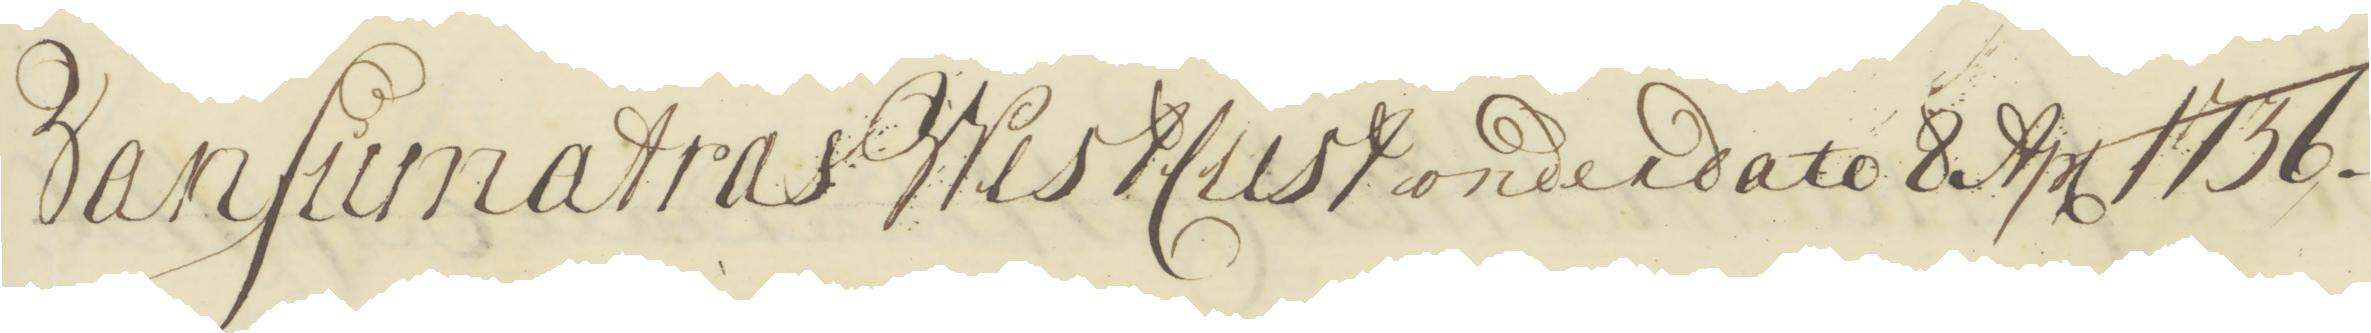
Van Sumatras WestCust onderdato 8Apr 1736-
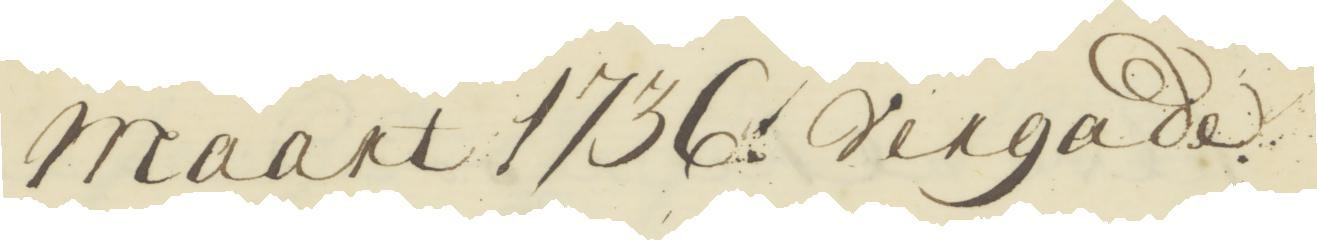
Maart 1736: Vergade
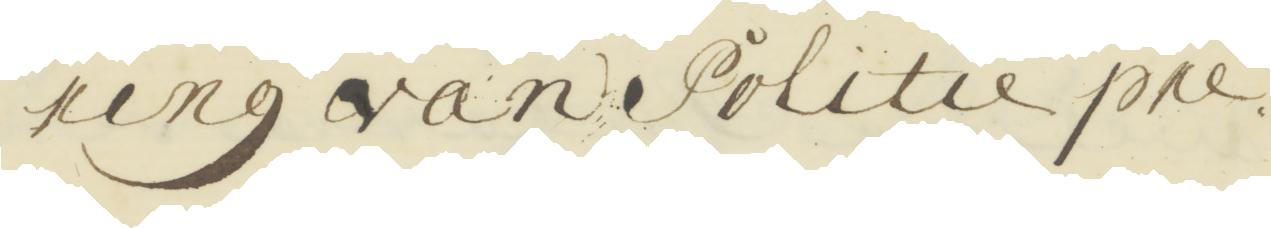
ring van Politie pre.
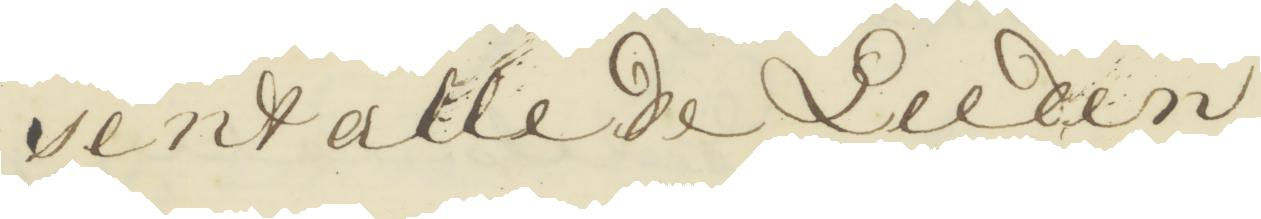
sent alle de Leeden,
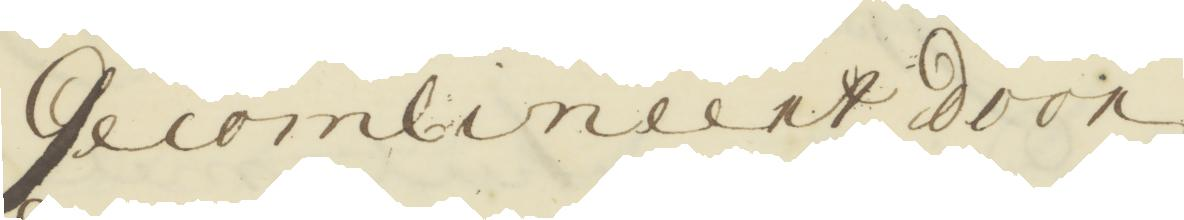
Gecombineert door
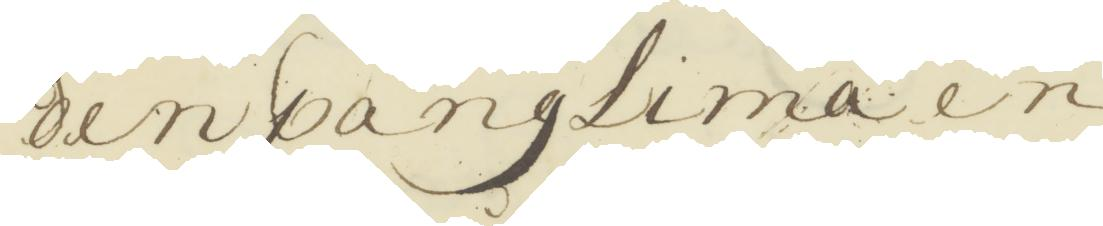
den panglima en
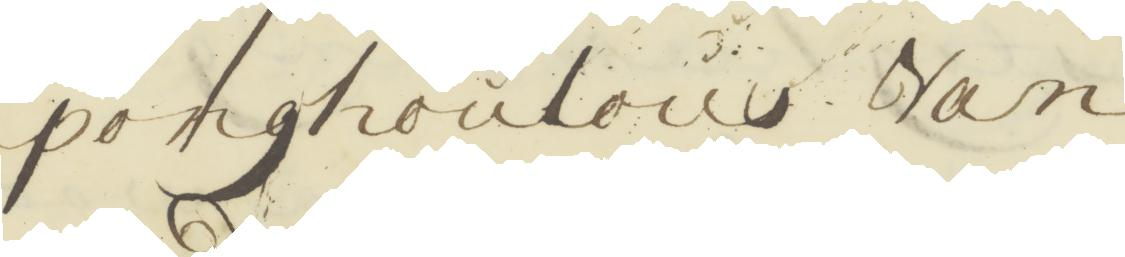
ponghoulous van
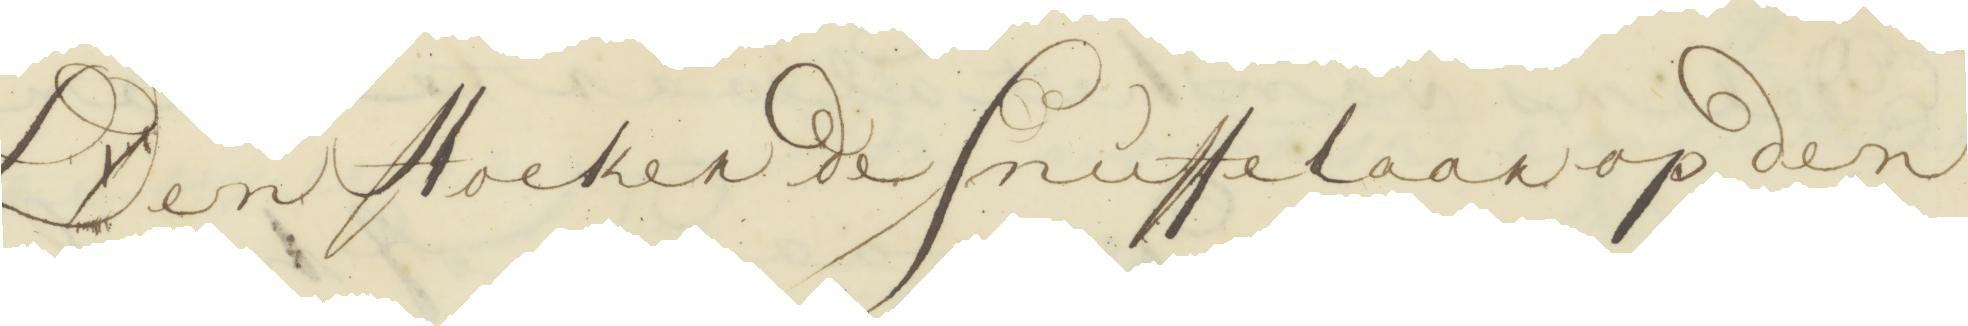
Den Hoeker de snuffelaar op den
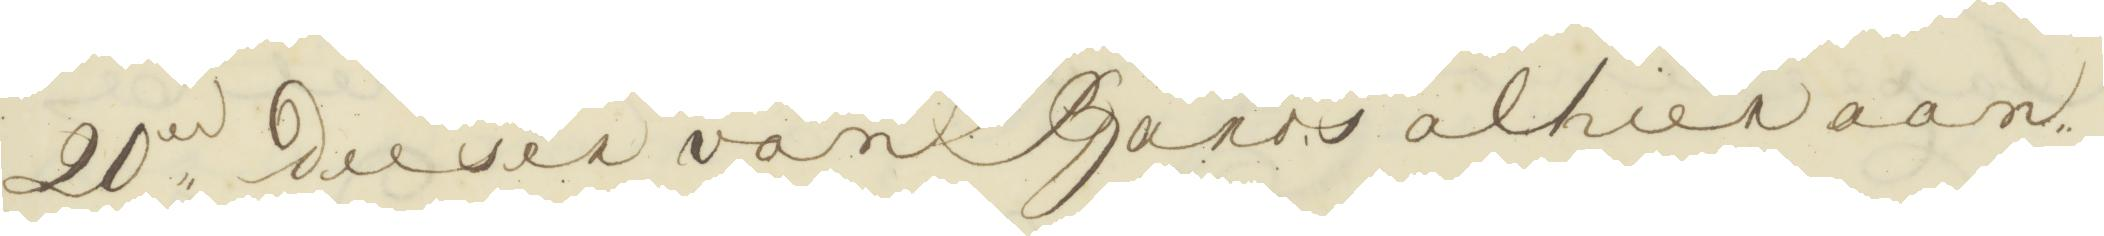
20„en deeser van Baros alhier aan„
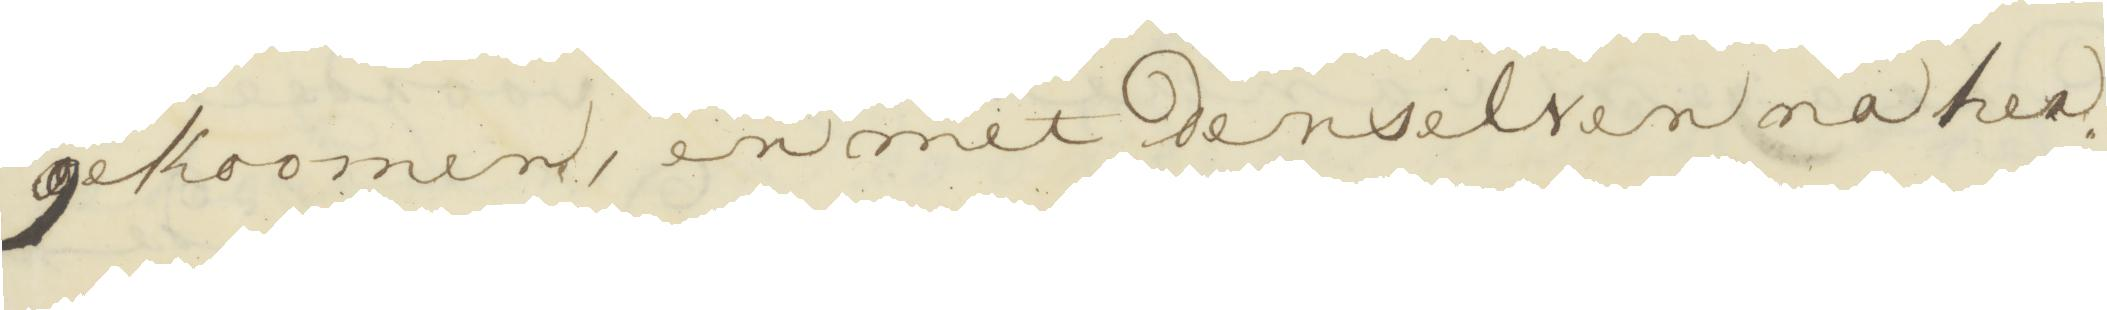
gekoomen, en met denselven na her„
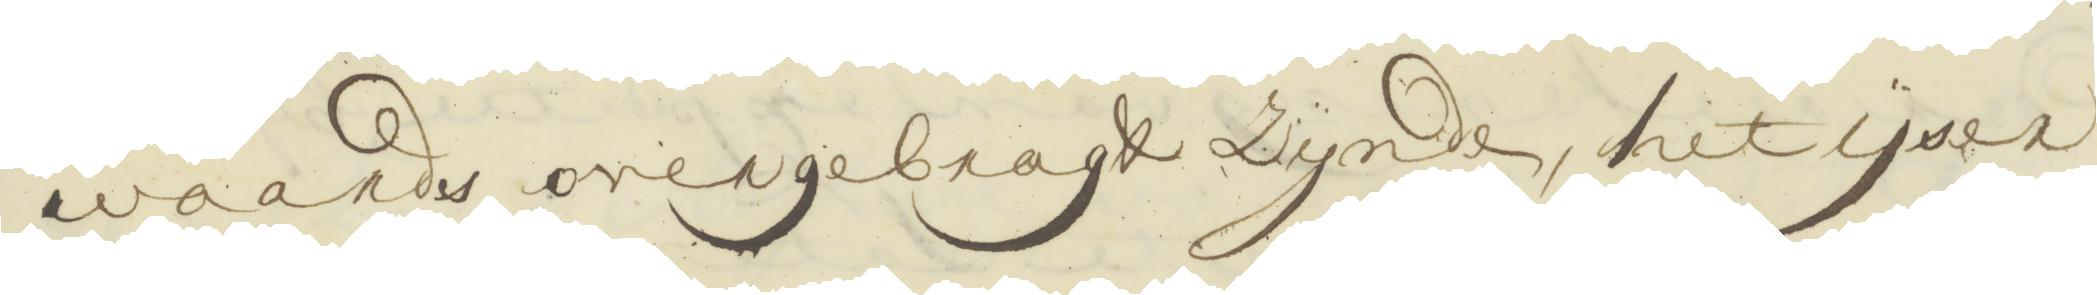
waards overgebragt zijnde, het ijser
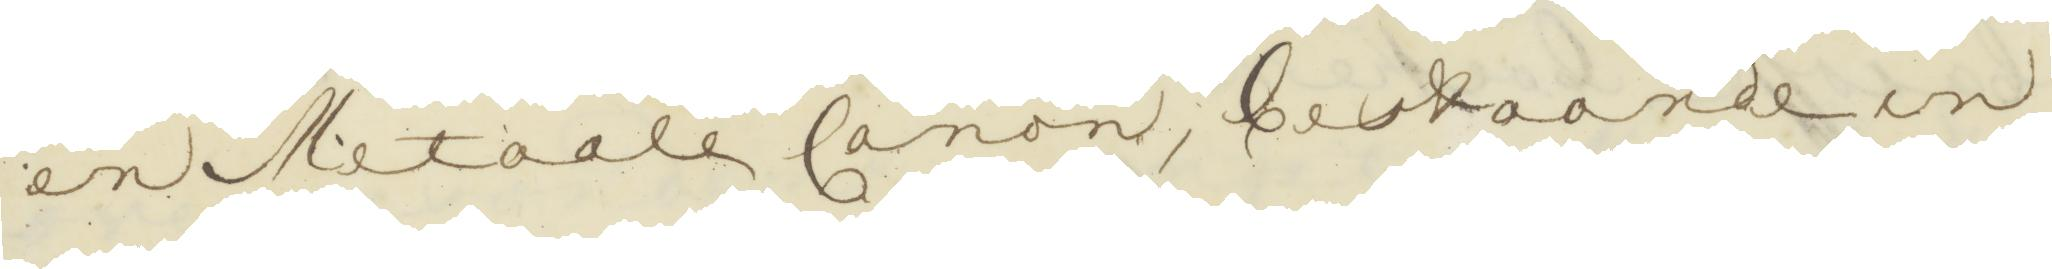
en Metaale canon, bestaande in
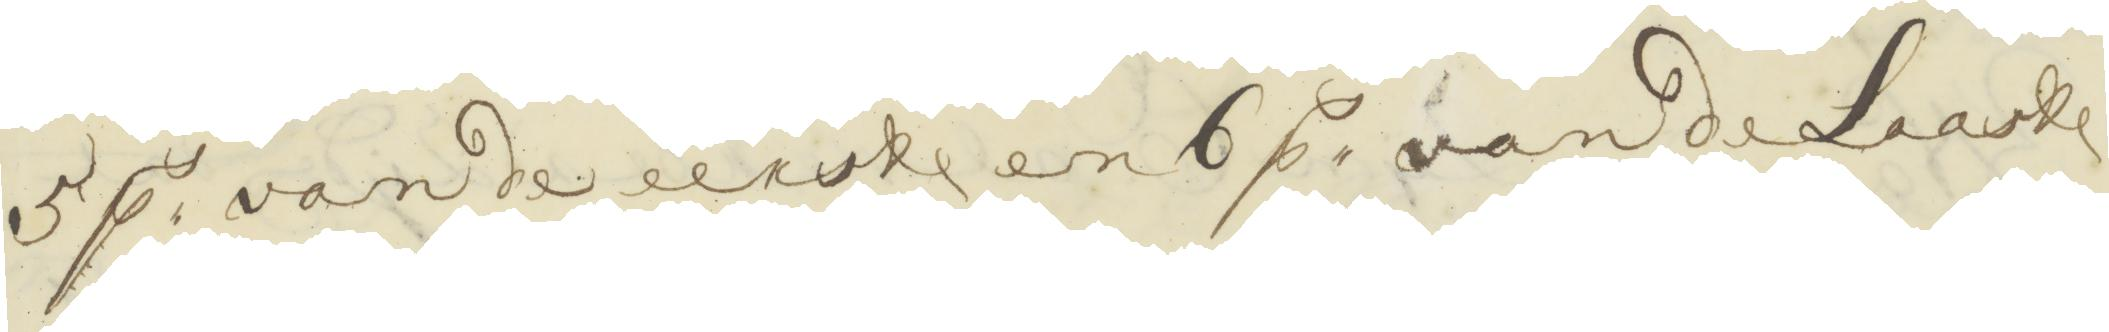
5 p:s van de eerste en 6p„s van de laaste
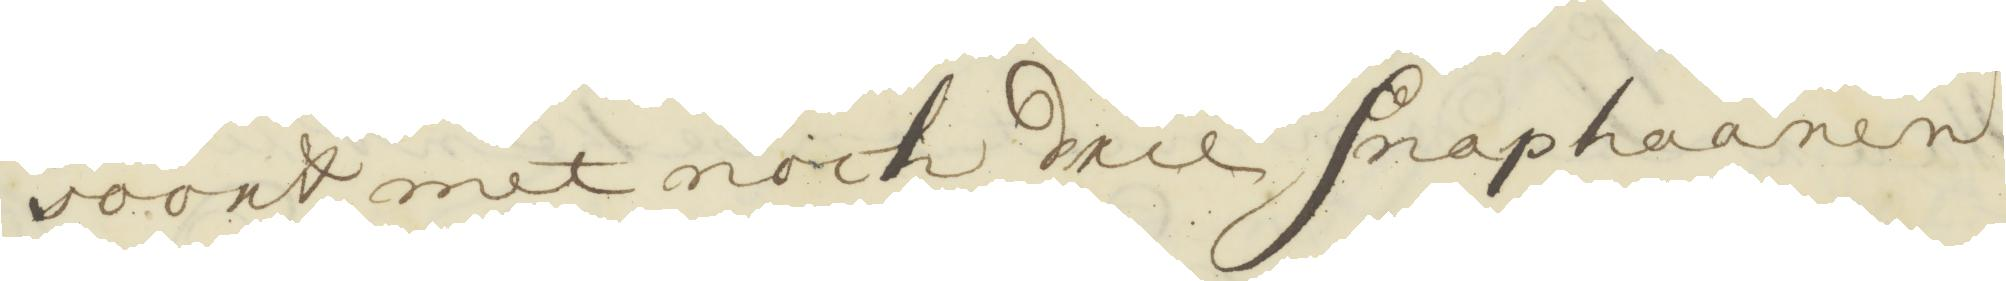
voort met noch drie snaphaaren
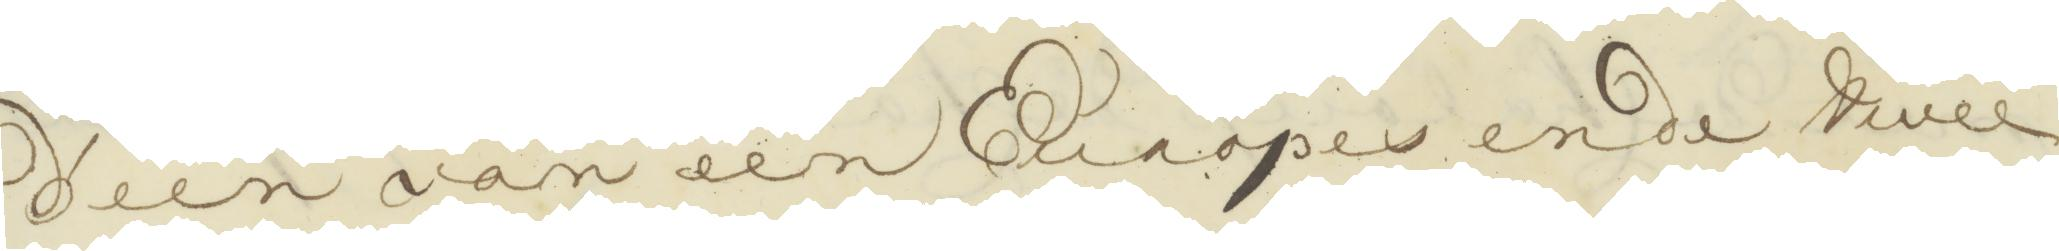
d'een van een Europes en de twee
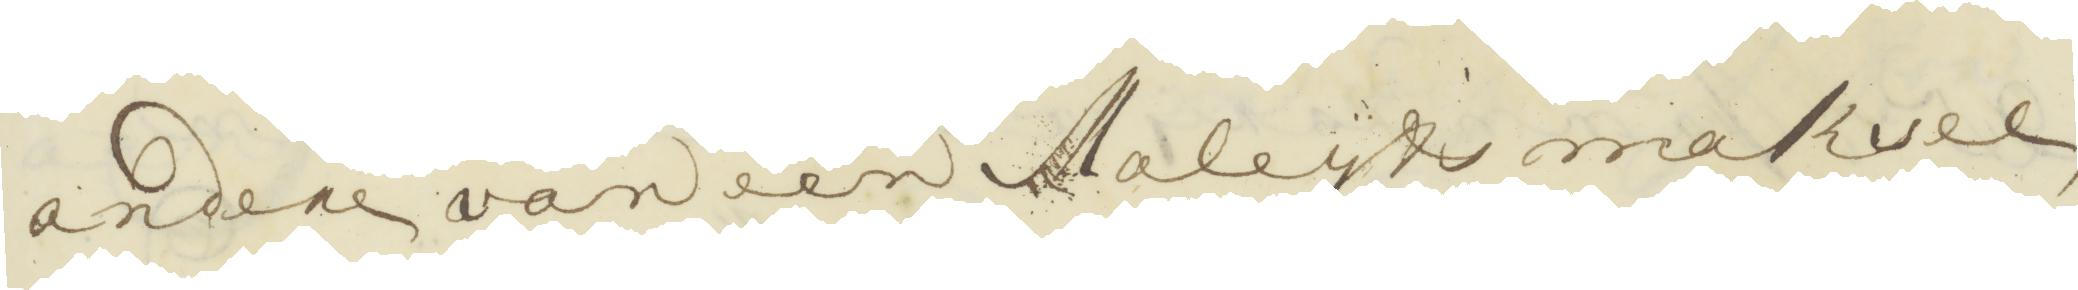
andere van een Maleijs maksel,
